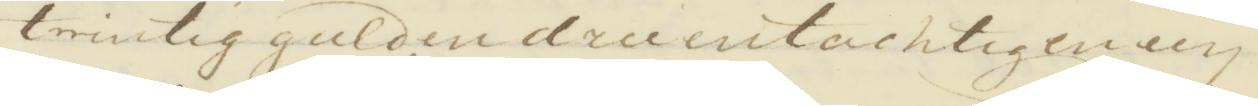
twintig gulden drie en tachtig en een
